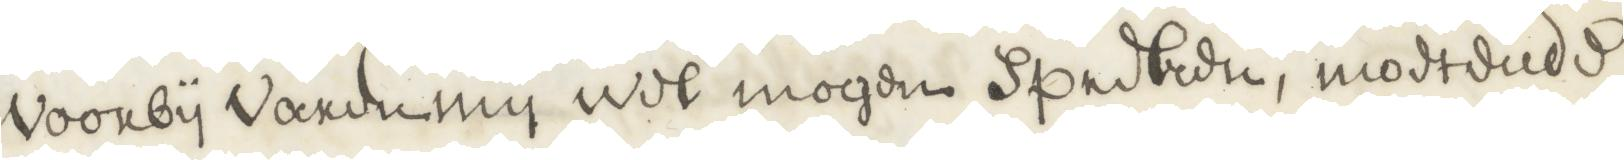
voorbij varen mij wel mogen spreken, moetende
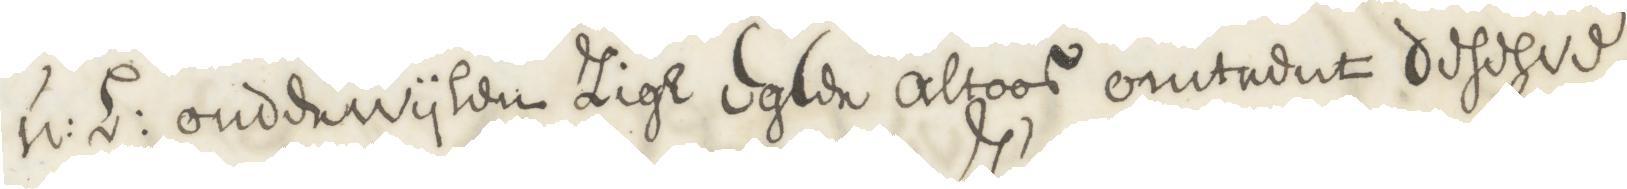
u: L: onderwijlen zigh egter altoos omtrent deselve
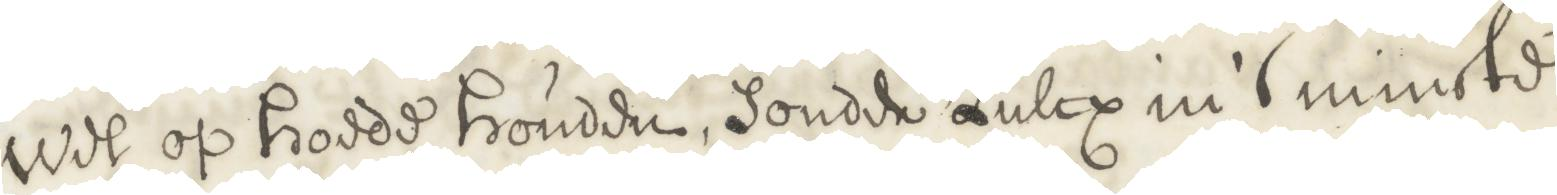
wel op hoede houden, sonder zulcx in ’t minste
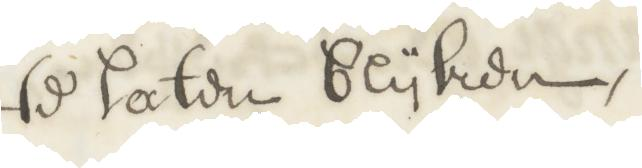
te laten blijken,
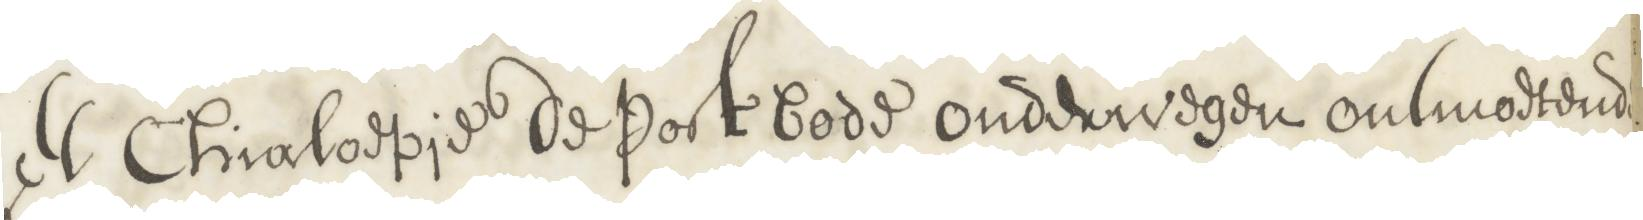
et Chialoepje de postbode onderwegen ontmoetend
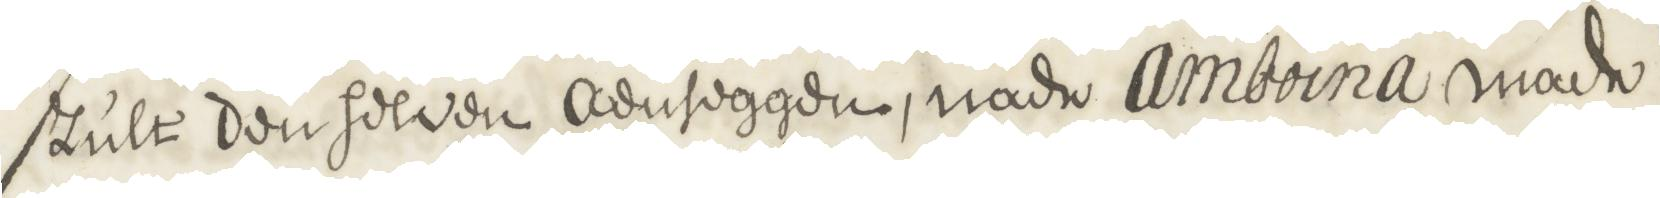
zult den selven aenseggen, naer Amboina maer
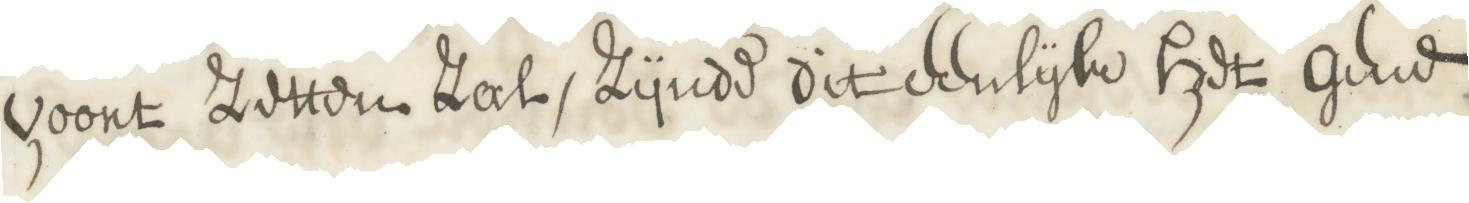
voort zetten zal, zijnde dit eenlijk het gene
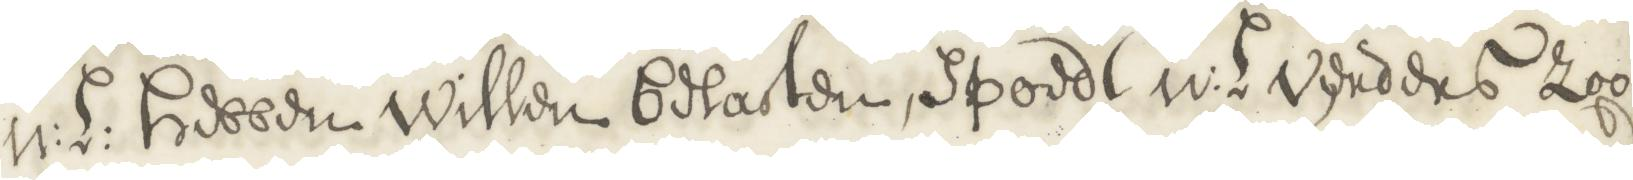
u: L: hebben willen belasten, spoedt u:L verders zoo
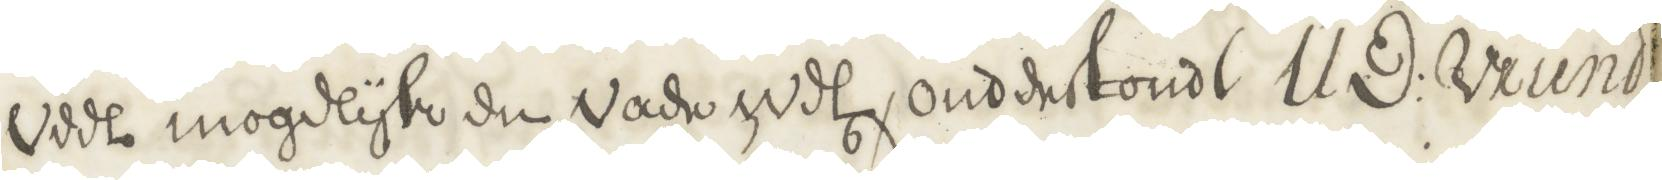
veel mogelijk en vaer wel, onderstondt UE: vrund
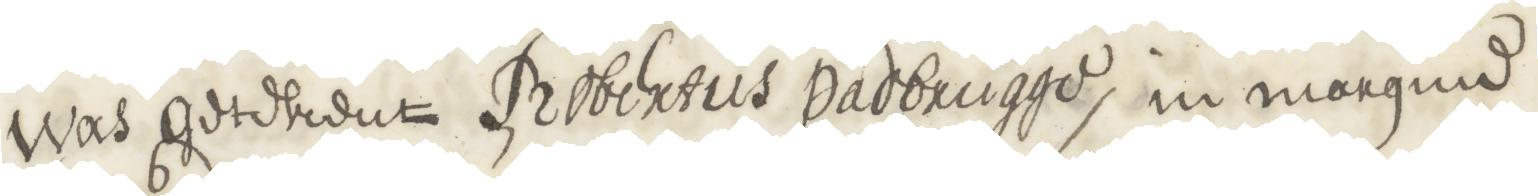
was getekent Robertus padbrugge, in margine
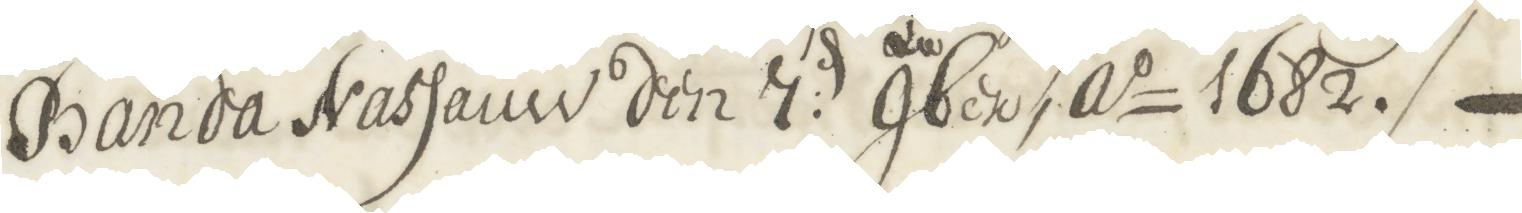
Banda Nassauw den 7:en 9ber, a=o 1682./ —
